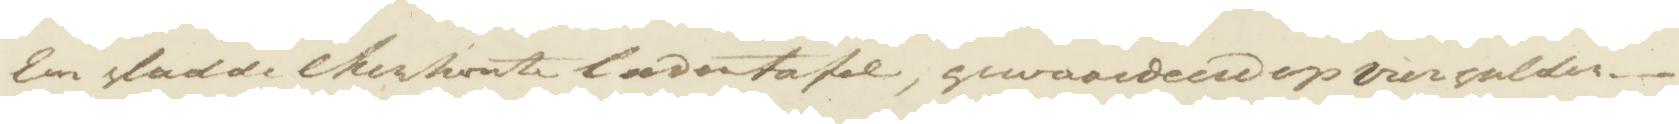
Een gladde ekenhoute ladentafel, gewaardeerd op vier gulden.
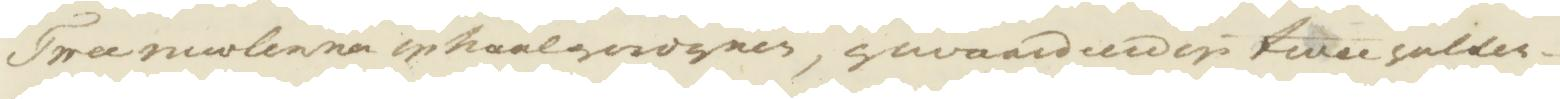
Twee ruwlinnen op haalgordynen, gewaardeerd op twee gulden
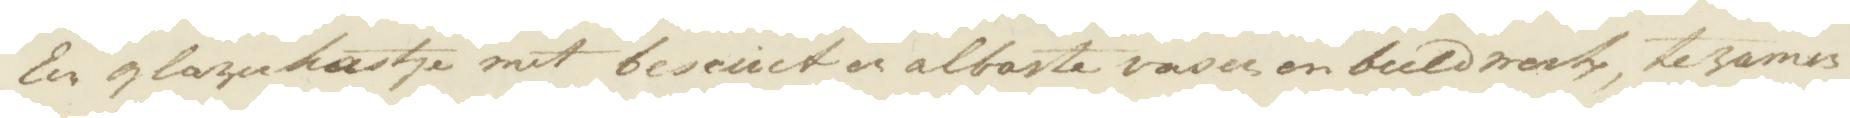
Een glazen kastje met bescuit en albaste vasen en beeldwerk, te zamen
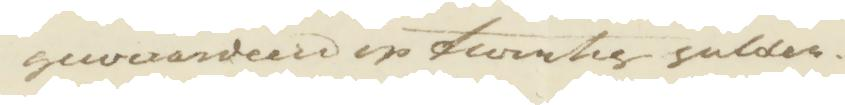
gewaardeerd op twintig gulden.
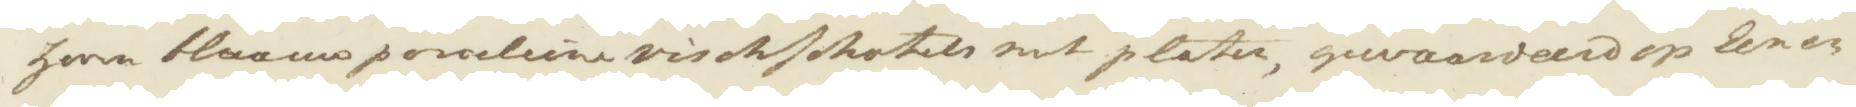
Zeven blaauw porceleine vischschotels met platen, gewaardeerd op Een en
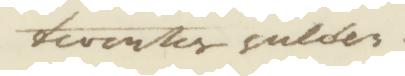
teventig gulden.
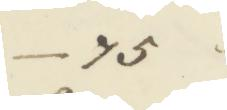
- 75
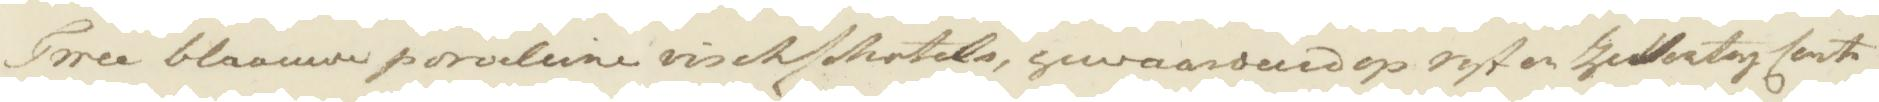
Twee blaauwe porceleine vischschotels, gewaardeerd op vyf en zeventig Cent
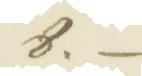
8. —
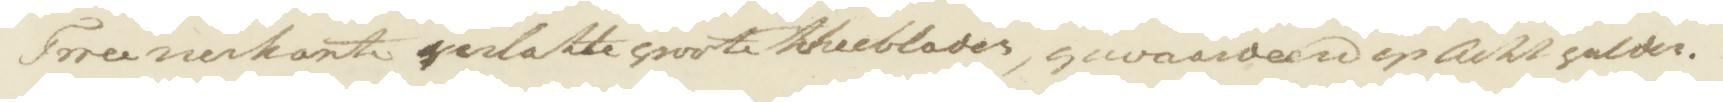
Twee vierkante verlakte groote theebladen, gewaardeerd op acht gulden.
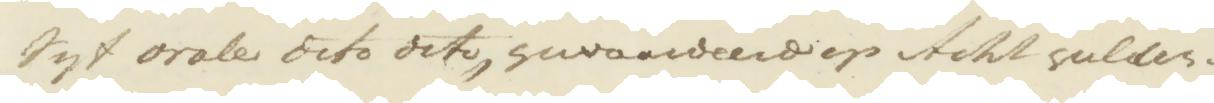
Vyf ovale dito dito gewaardeerd op Acht gulden.
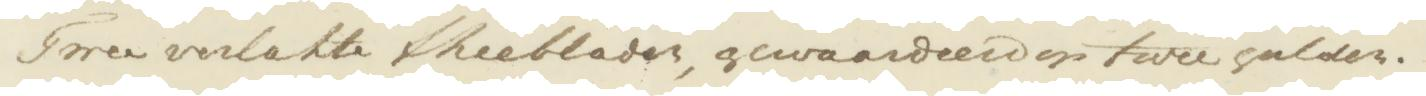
Twee verlakte theebladen, gewaardeerd op twee gulden.
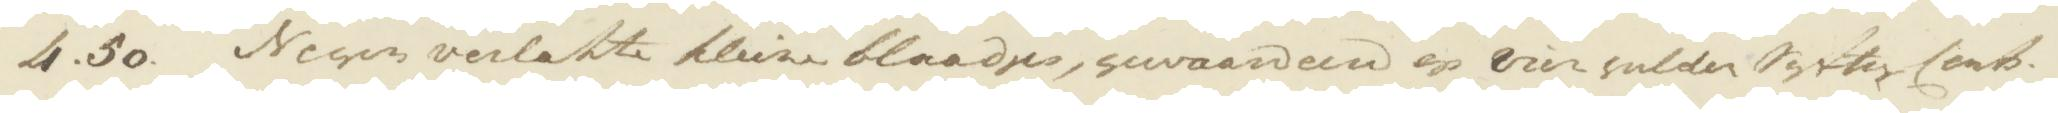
4.50. Negen verlakte kleine blaadjes, gewaardeerd op vier gulden Vyftig Cents.
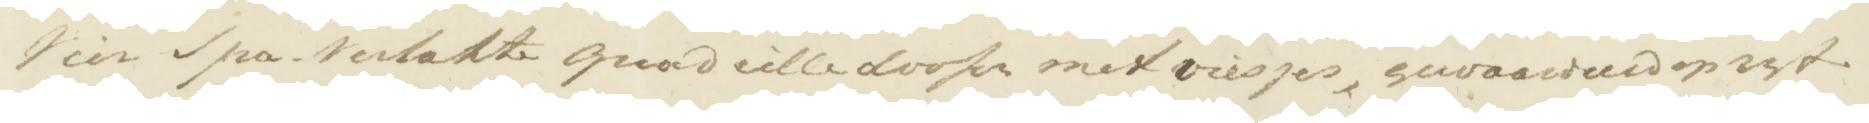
Vier Spa-verlakte quadrille doosjes met viesjes, gewaardeerd op vyf
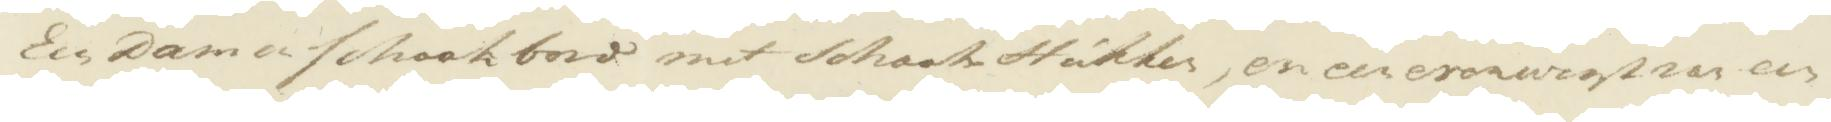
Een Dam- en schaakbord met schaakstukken, en een evenwigt van een
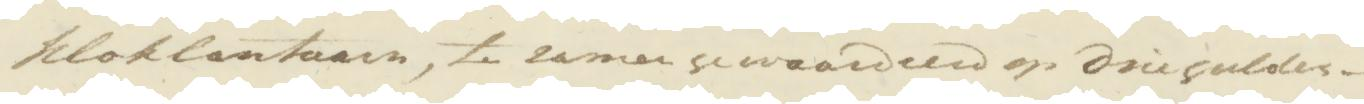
kloklantaarn, te zamen gewaardeerd op drie gulden.
